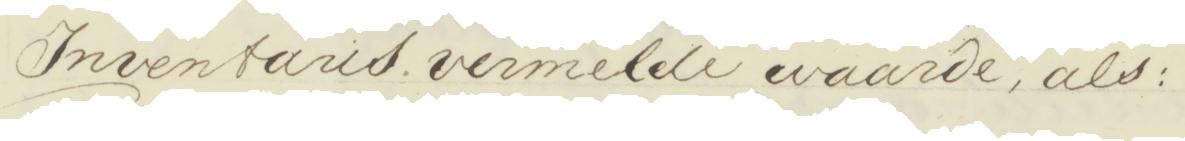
Inventaris vermelde waarde, als:
